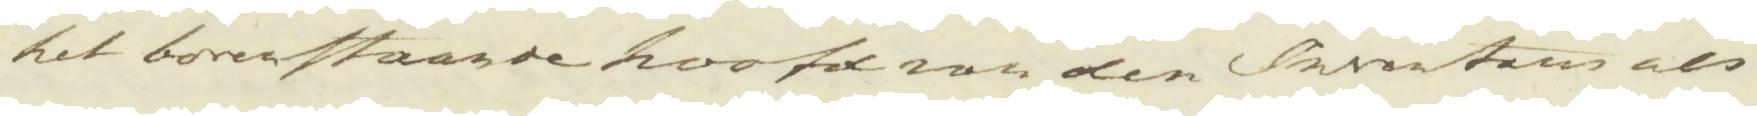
het bovenstaande hoofd van den Inventaris als
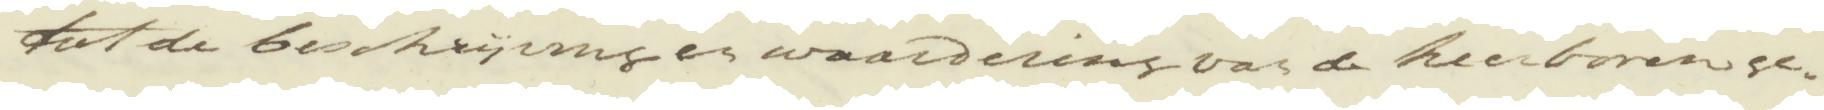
tot de beschrijving en waardering van de hierboven ge„
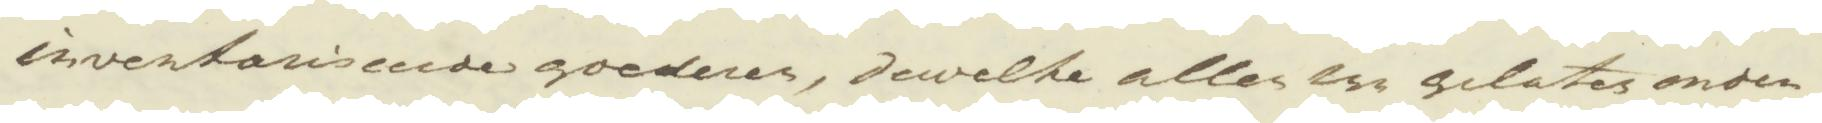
inventariseerde goederen, dewelke allen zyn gelaten onder
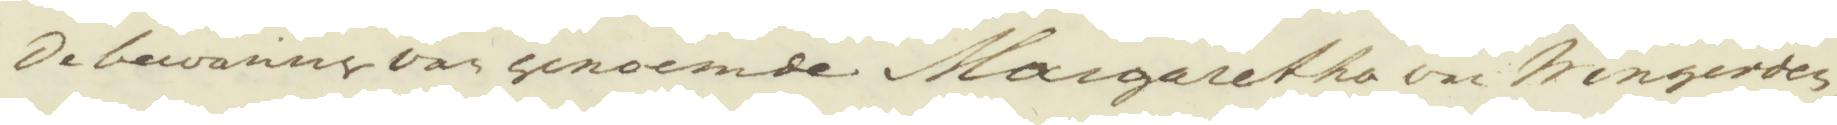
de bewaring van genoemde Margaretha van Wingerden
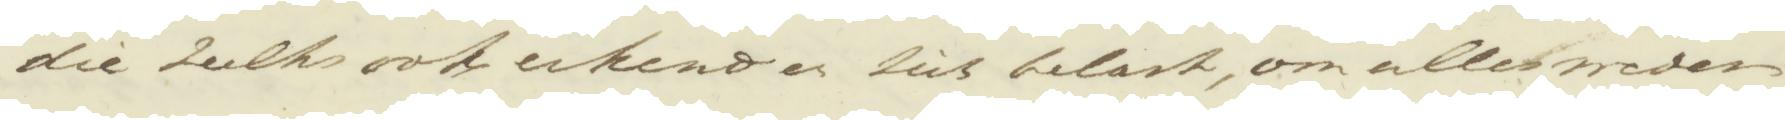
die zulk ook erkend en zich belast, om alles weder
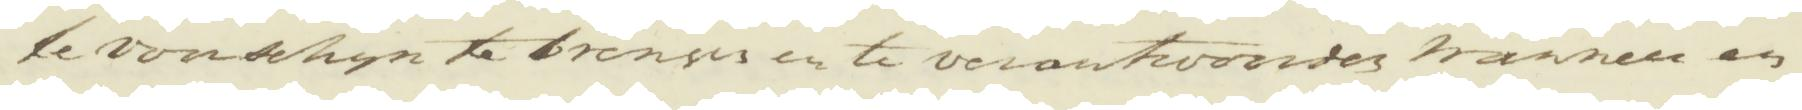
te voorschyn te brengen en te verantwoorden wanneer en
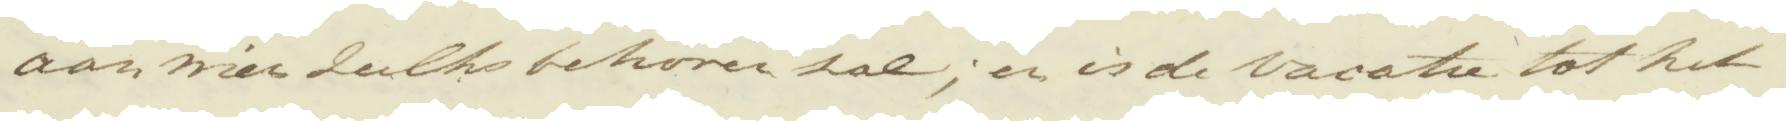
aan wier zulks behoren zal; en is de vacatie tot het
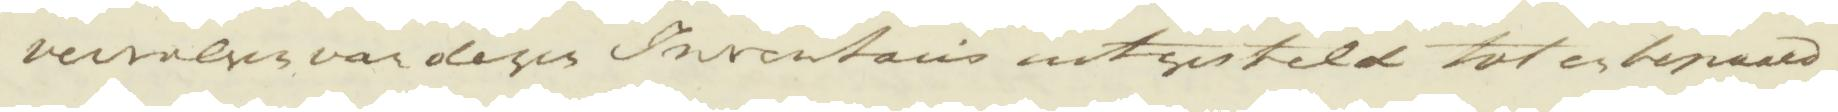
vervolgen van dezen Inventaris uitgesteld tot en bepaard
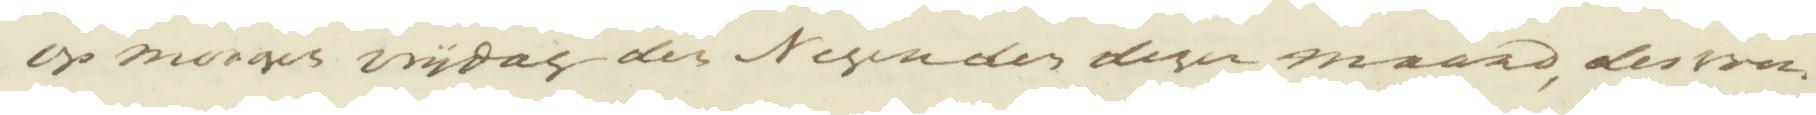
op morgen vrijdag den Negenden dezen maard, des over.
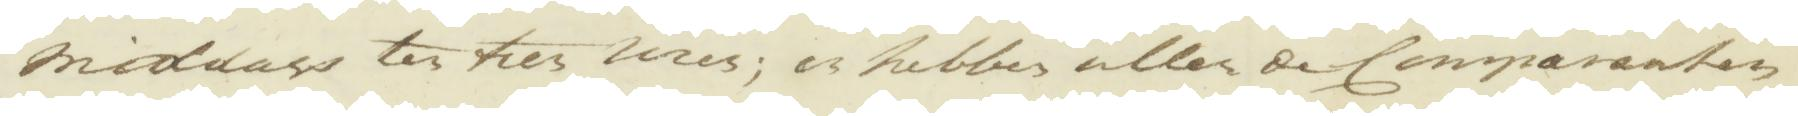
middags ten tien uren; en hebben allen de Comparanten
